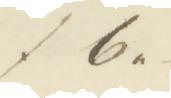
ƒ 6„
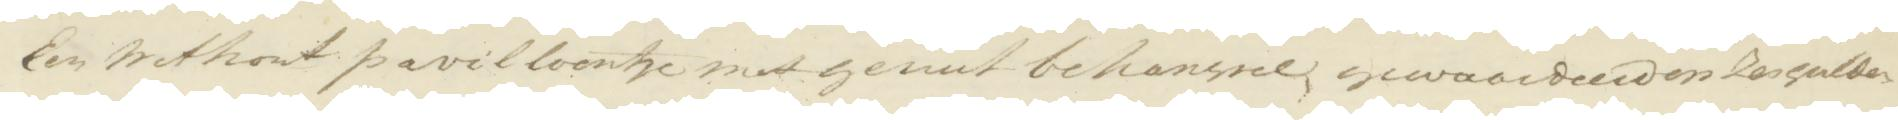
Een without pavilloentje met gewit behangsel gewaardeerd op zes gulden
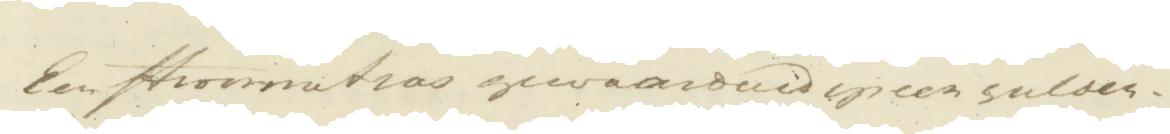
Een stroomatras gewaardeerd op een gulden.
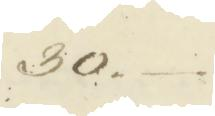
30„ —
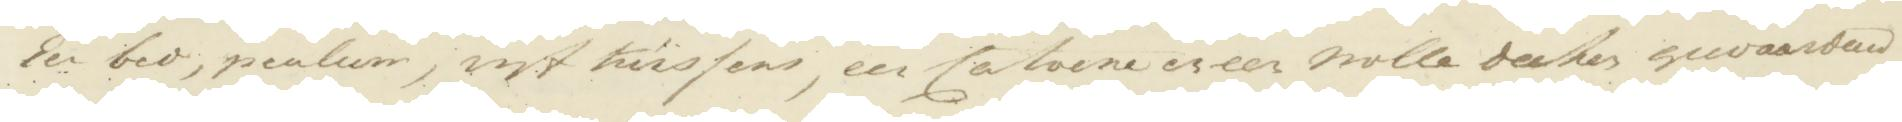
Een bed, peuluw, vyf kussens, een Catoene en een wolle deeken gewaardeerd
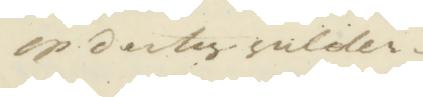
op dertig gulden
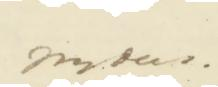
wyders.
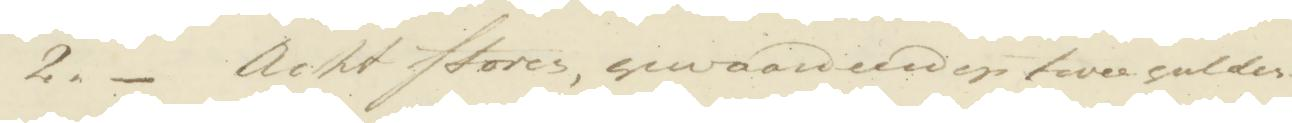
2„ — Acht stoven, gewaardeerd op twee gulden
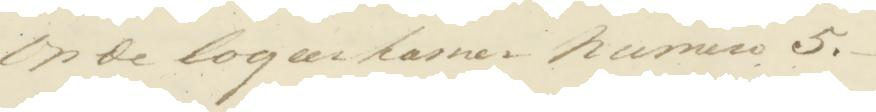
Op de logeerkamer Numero 5.
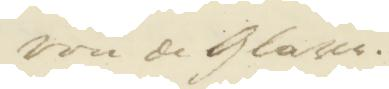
voor de Glazen.
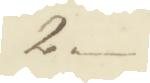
2 „—
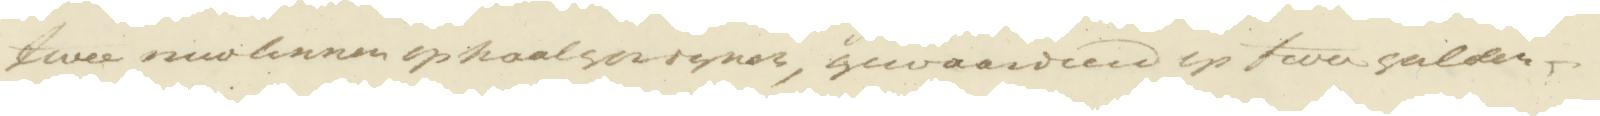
twee ruwlinnen op haalgordynen, gewaardeerd op twee gulden,-
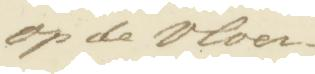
op de vloer
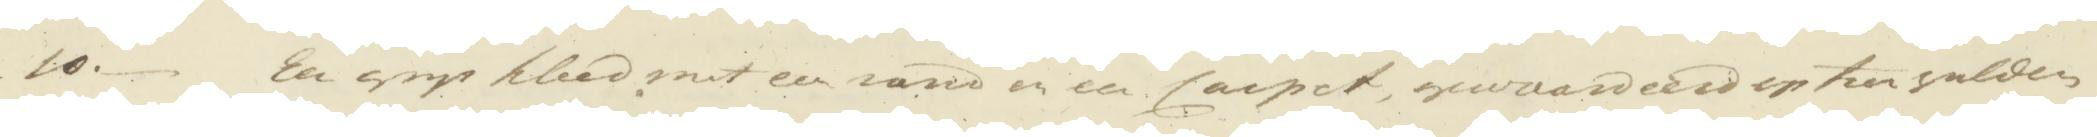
10. - Een grys kleed met en rand en een Carpet, gewaardeerd op tien gulden
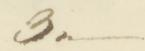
3„ -
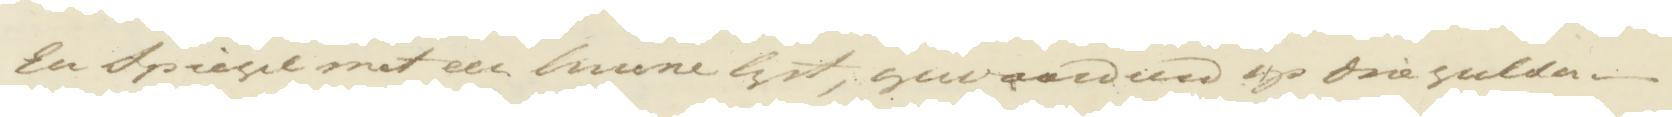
En spiegel met een bruine lyst, gewaardeerd op drie gulden
